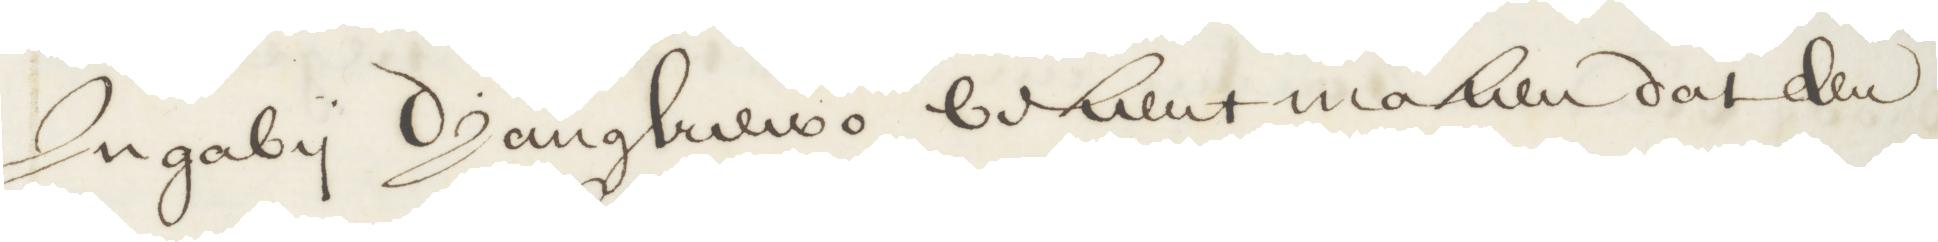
Ingabij djangkewo bekent maken dat den
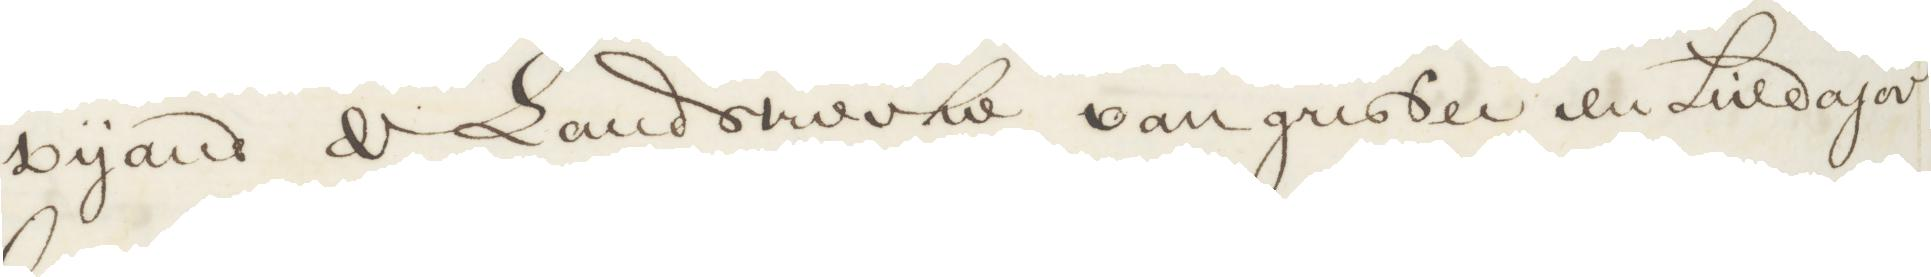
vijand de Landstreeke van grissee en Suldajoe
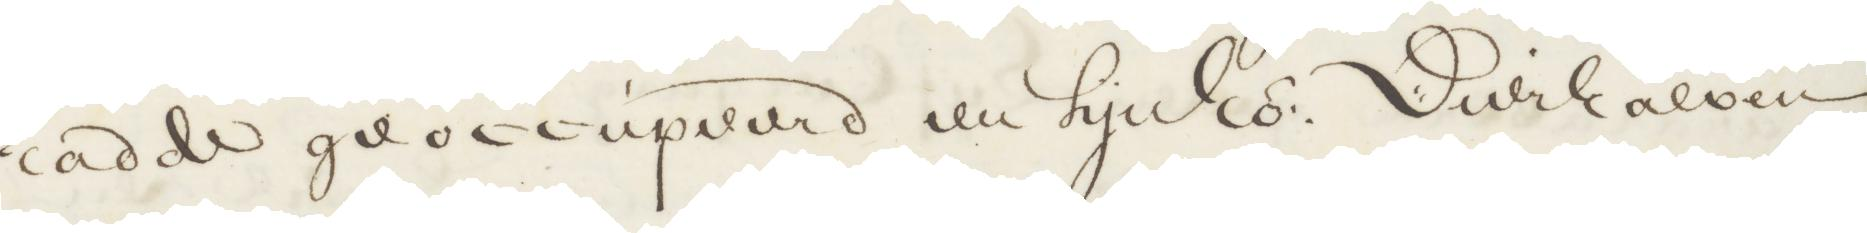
hadde geoccupeerd en Sijn ho: Dierhalven
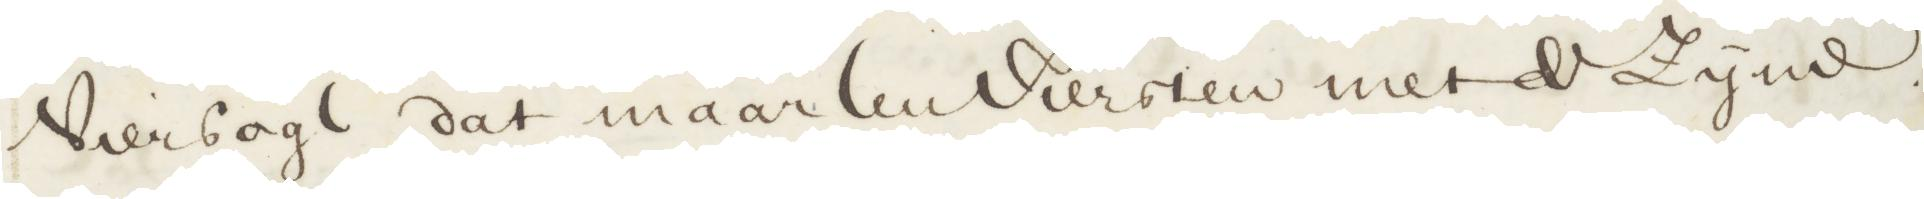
Versogt dat maar ten Eersten met de Zijne
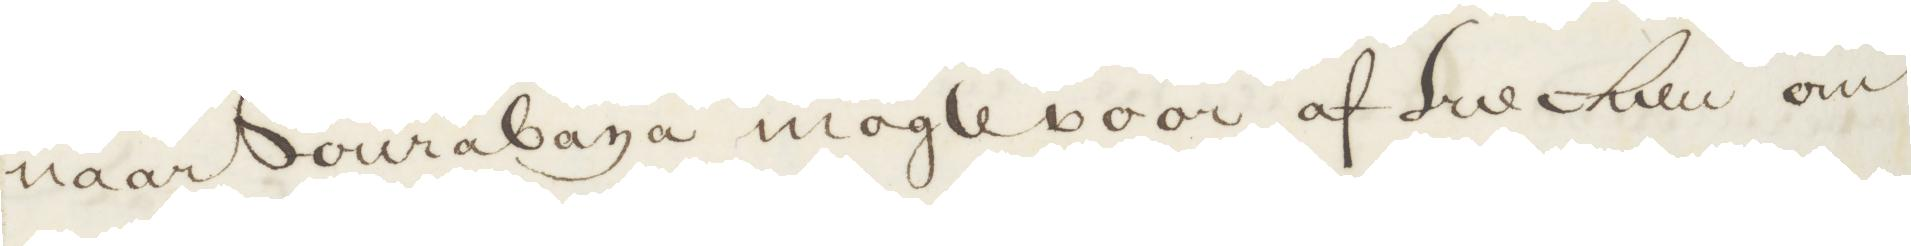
naar Sourabaija mogte voor af trecken om
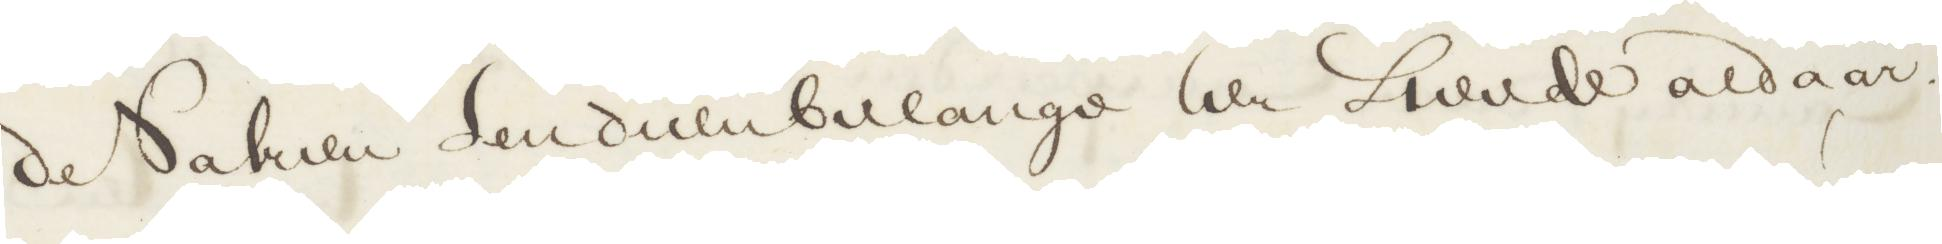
de Saken ten dienbelange ter steede aldaar
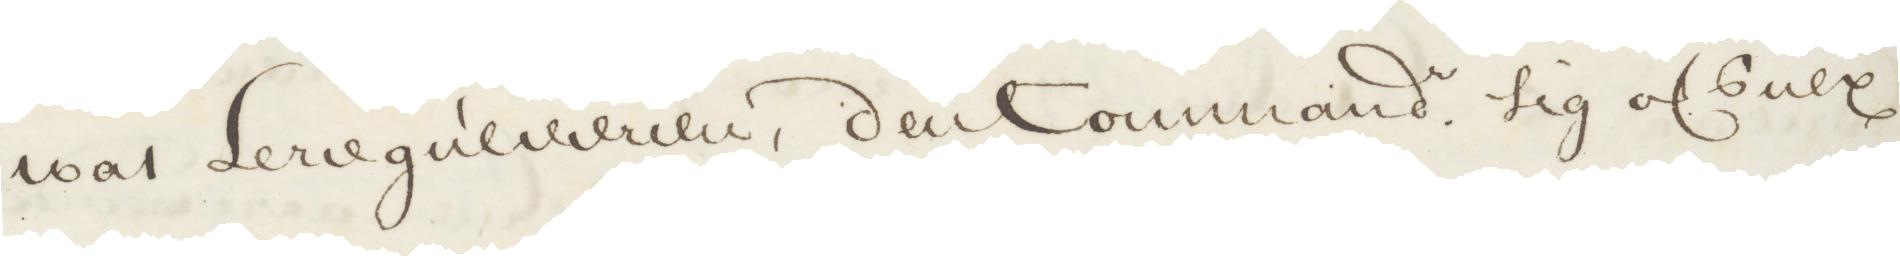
wat tereguleeren, den Command.r sig of sulx
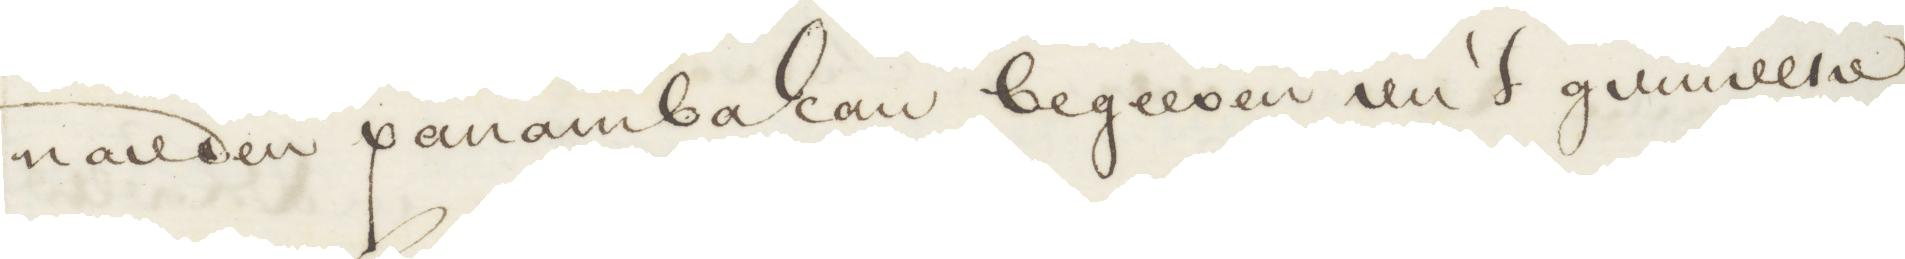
nae den panambahan begeeven en ’t gemelte
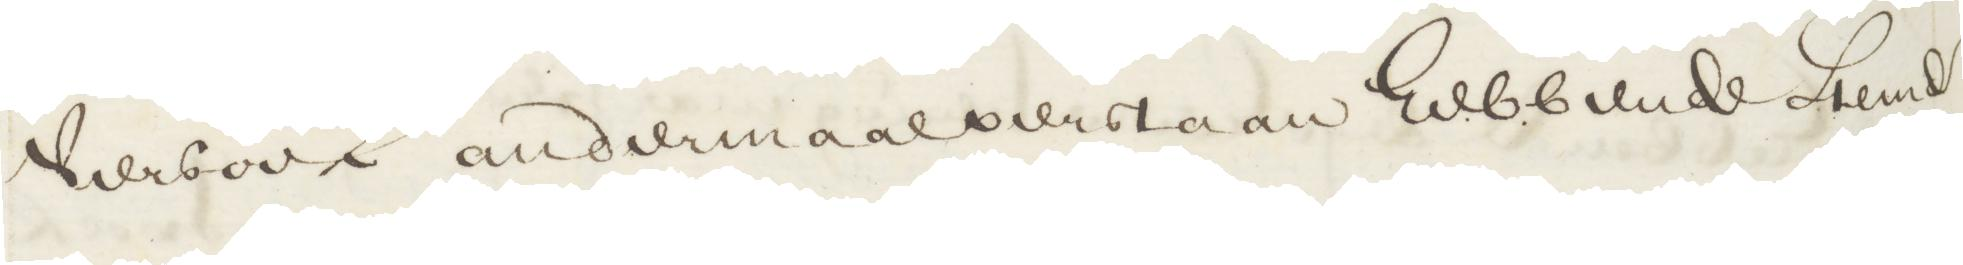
versoek andermaal verstaan hebbende stemde
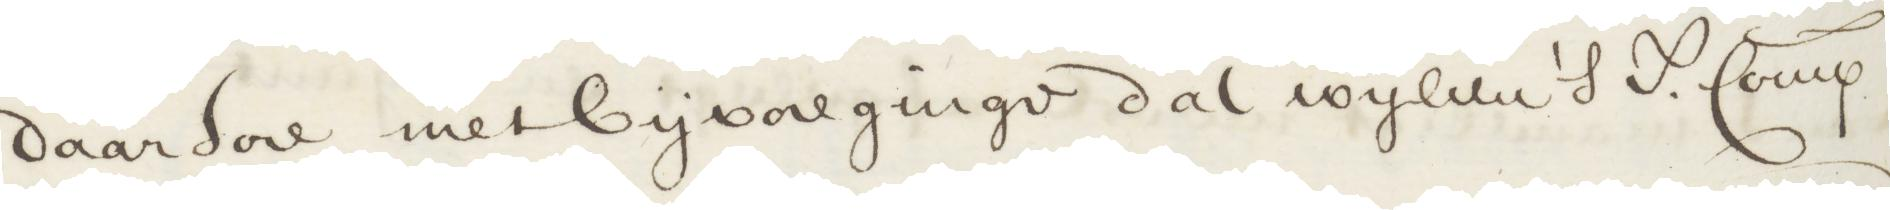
daar toe, met bijvoeginge dat wijlen ’S E. Comp.
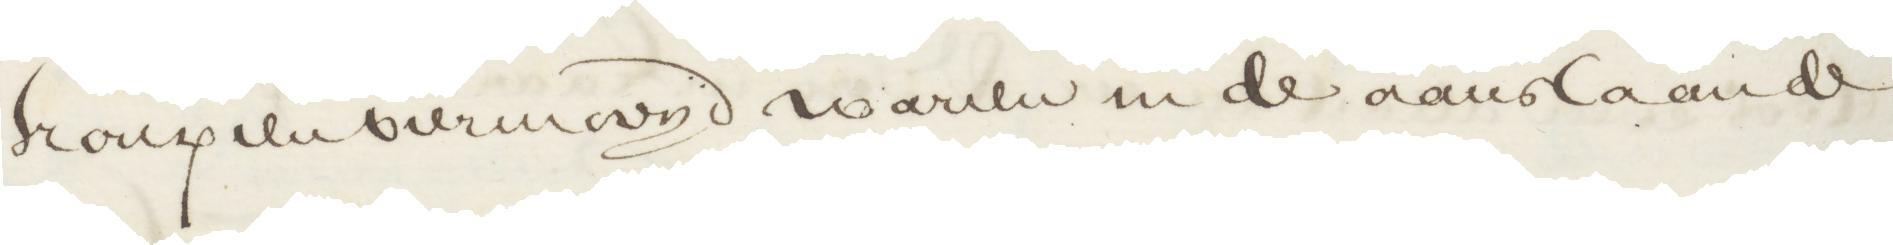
troupen vermoeijd waren in de aanstaande
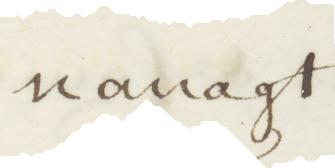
nanagt
